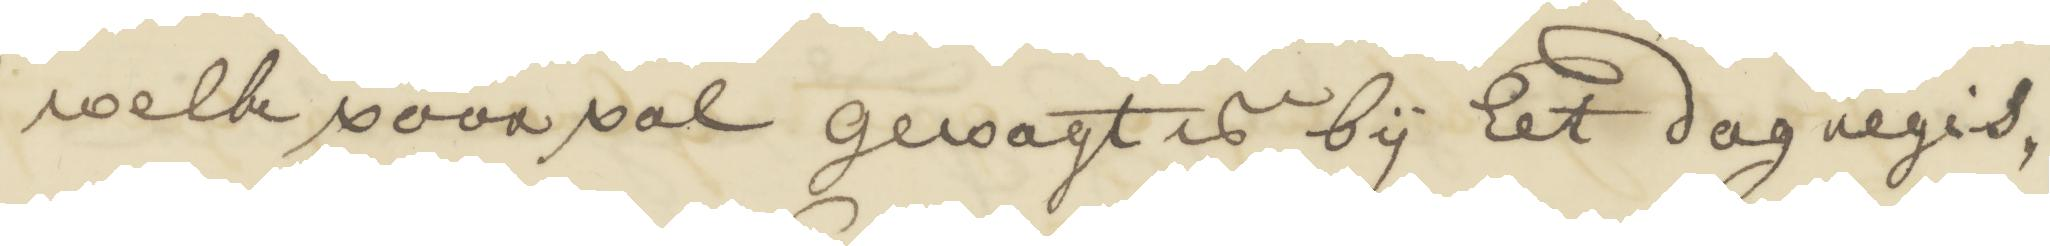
welk voor val gewagt is bij het dag regis„
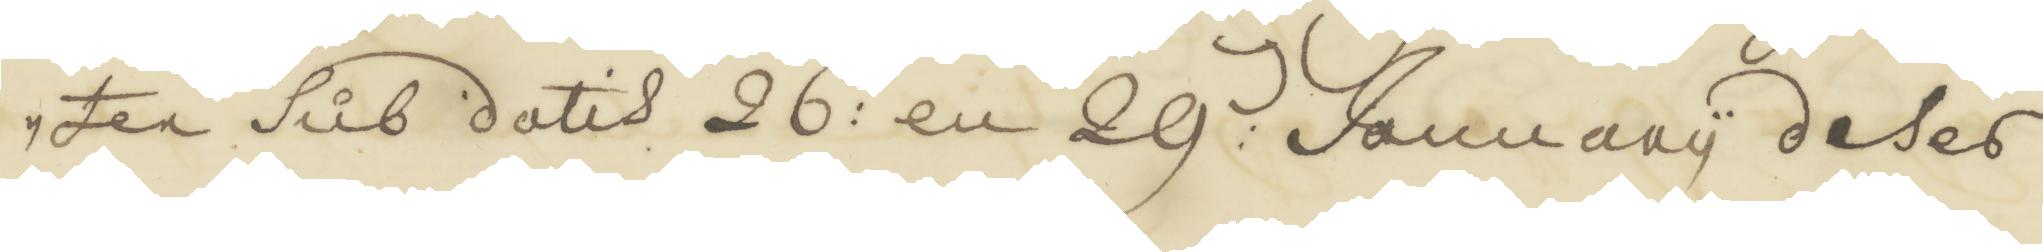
„ter sub datis 26: en 29:' Ianuarij deses
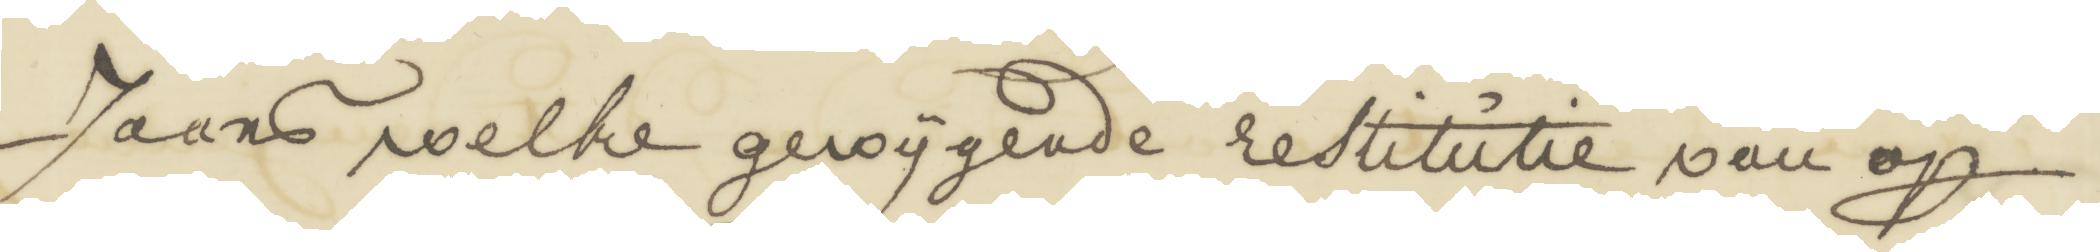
Jaars welke gewijgerde restitutie van op
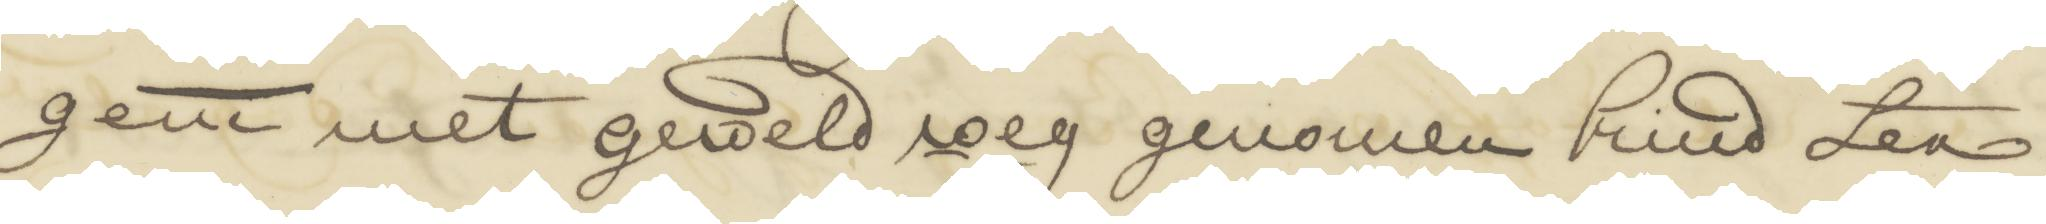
gem met geweld weg genomen kind ter
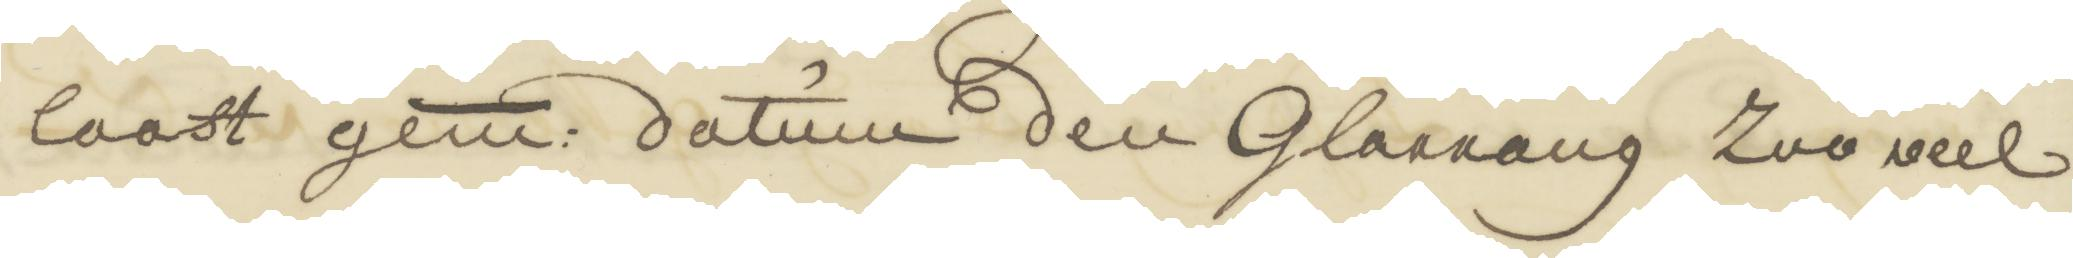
laast gem: datum den Glarrang zoo veel
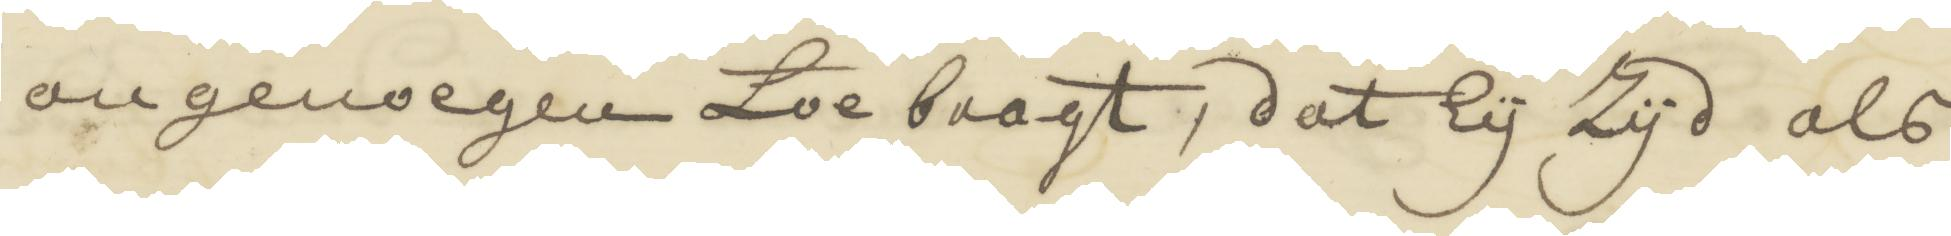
ongenoegen toe bragt, dat hij zijd als
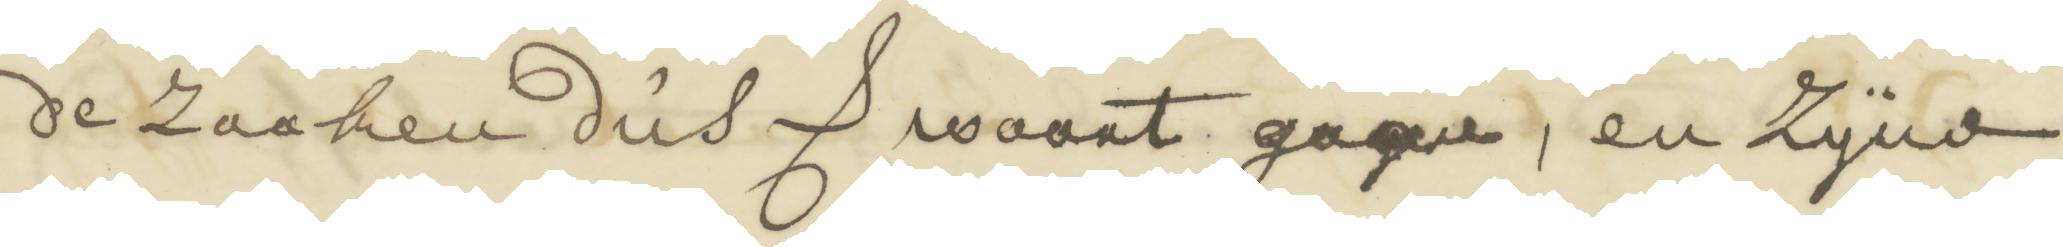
de zaaken dus verwaart gaan, en zijne
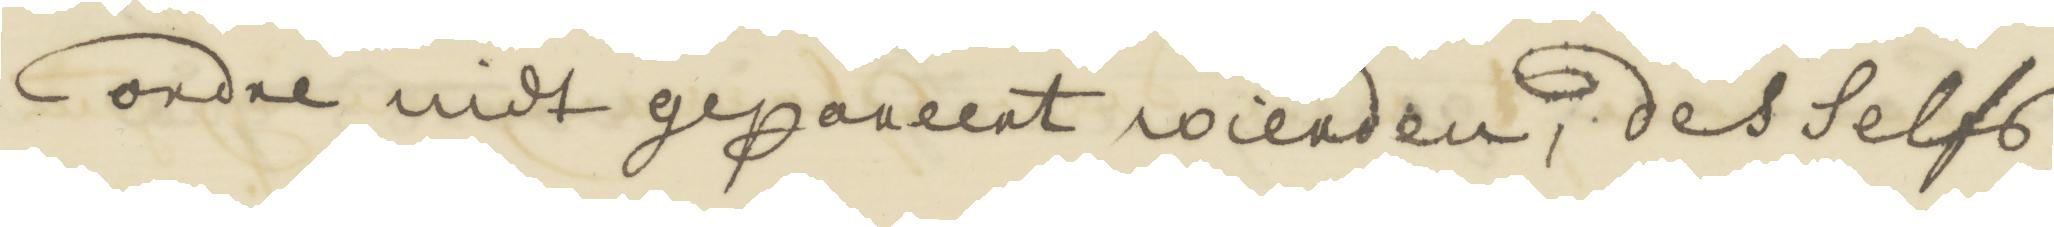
ordre niet gepareert wierden, desselfs
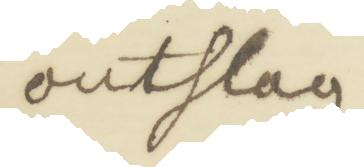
ontslag
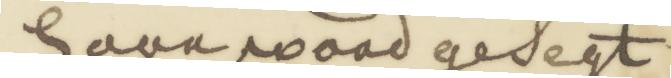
haar word gesegt
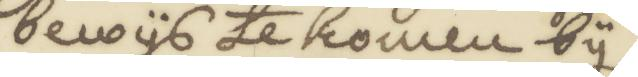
bewijs te komen bij
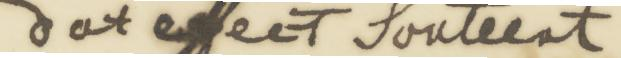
dat effect sorteert
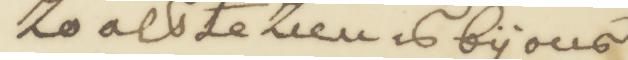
zo als te zien is bij ons
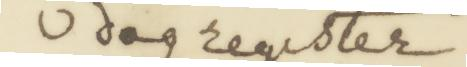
dag register
